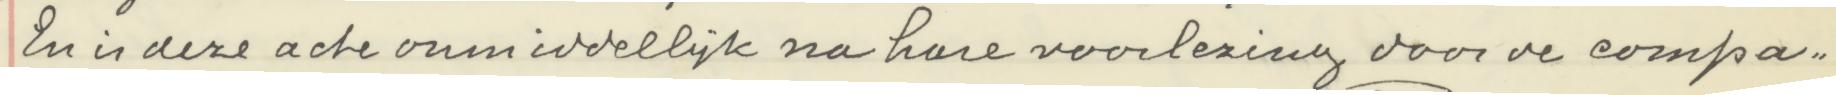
En is deze acte onmiddellijk na hare voorlezing door de compa„
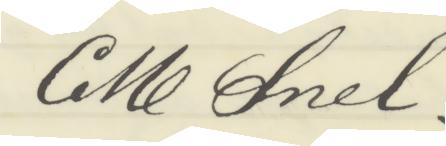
CM Snel
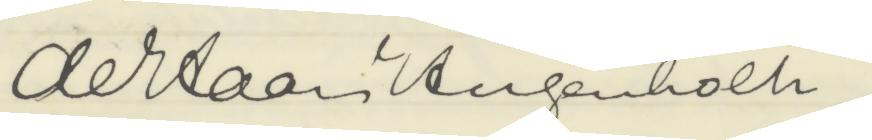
deHaan Hugenholz
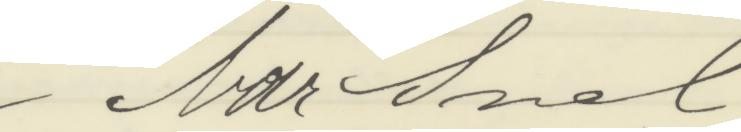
Adr Snel
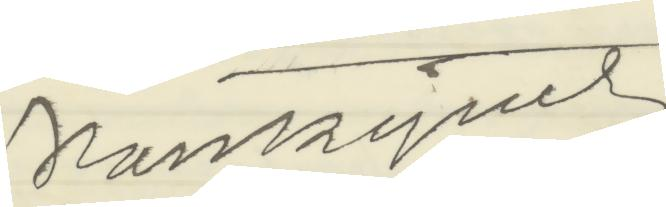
vanrijssel
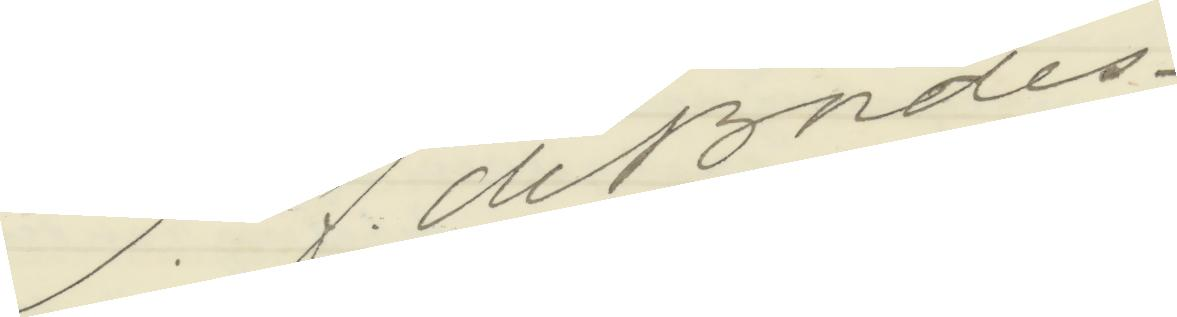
P. F. de Bordes
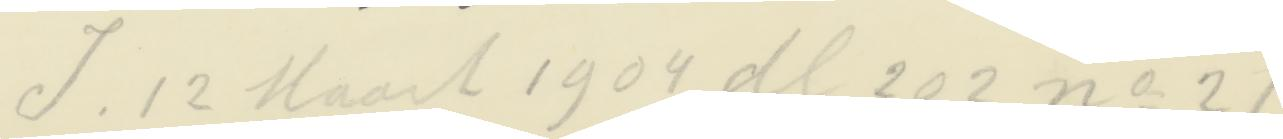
I. 12 Maart 1904 dl 202 n=o 21
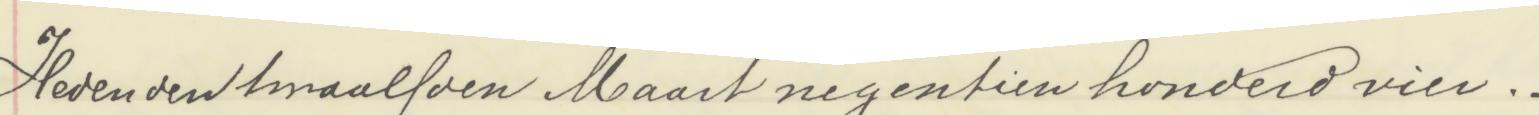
Heden den twaalfden Maart negentien honderd vier.
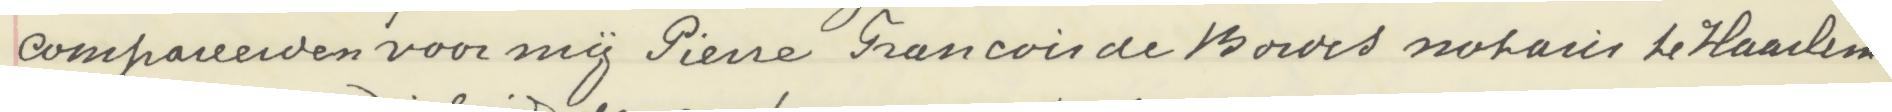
compareerden voor mij Pierre Francois de Bordes notaris te Haarlem
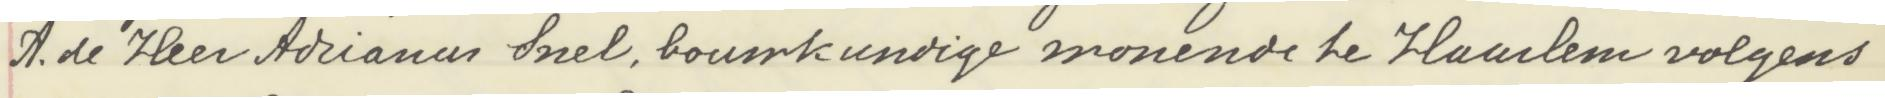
A. de Heer Adrianus Snel, bouwkundige wonende te Haarlem volgens
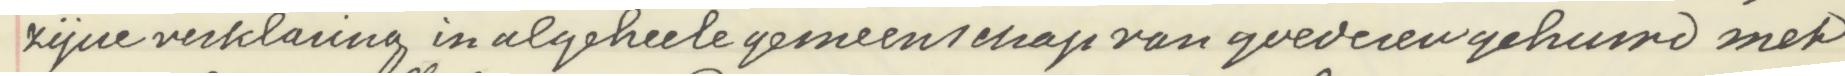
zijne verklaring in algeheele gemeenschap van goederen gehuwd met
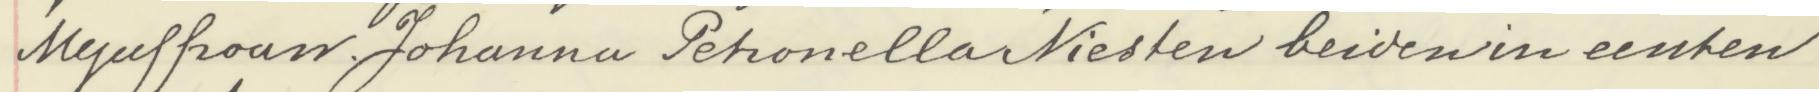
Mejuffrouw, Johanna Petronella Niesten beiden in eersten
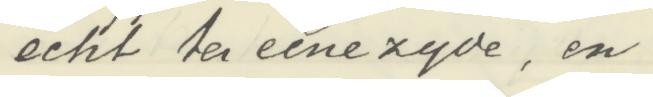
echt ter eene zyde, en
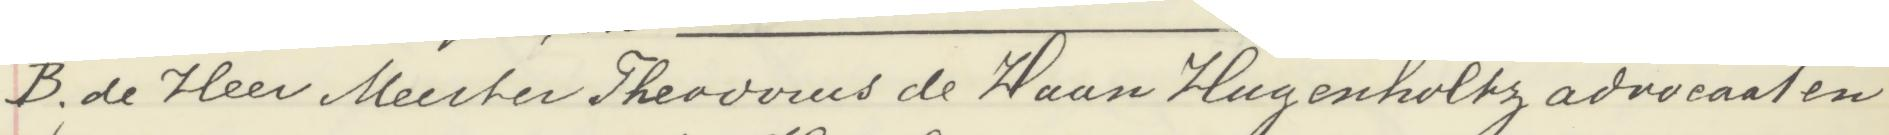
B. de Heer Meester Theodorus de Haan Hugenholtz advocaat en
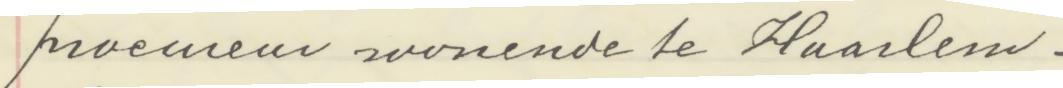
procureur wonende te Haarlem.
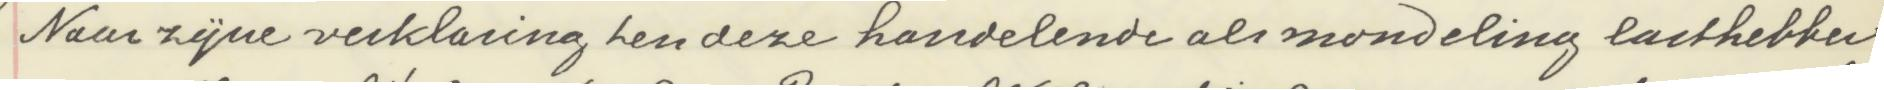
Naar zijne verklaring ten deze handelende als mondeling lasthebber
